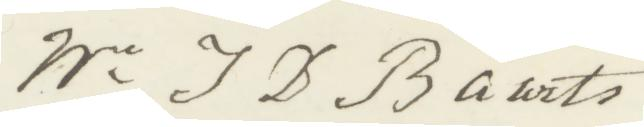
W=n J D Baarts
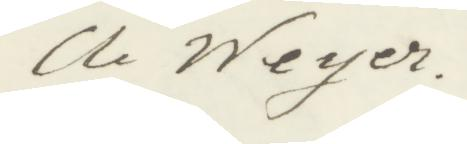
de Weyer.
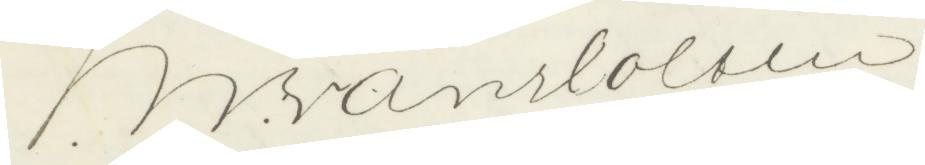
I. W. van Holten
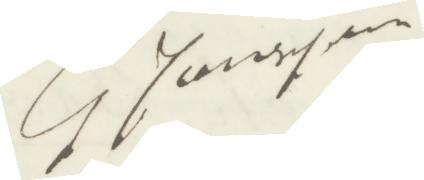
G Janssen
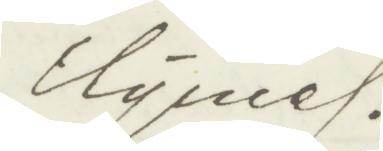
Hijinck
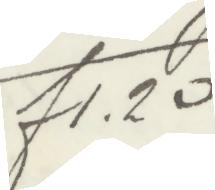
ƒ1.26
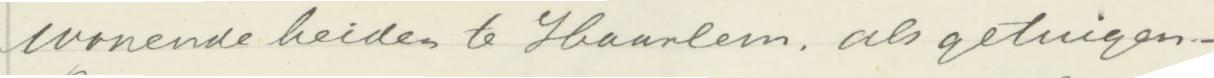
wonende beiden te Haarlem, als getuigen.
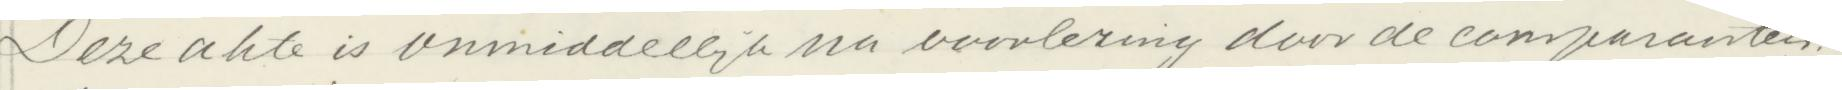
Deze akte is onmiddellijk na voorlezing door de comparanten.
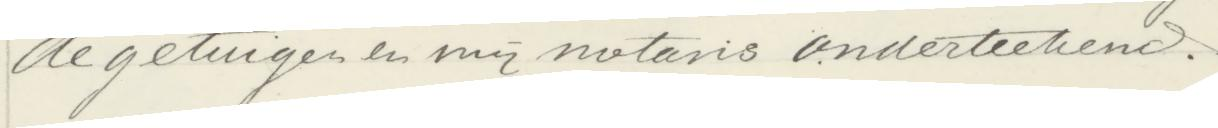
de getuigen en mij notaris onderteekend.
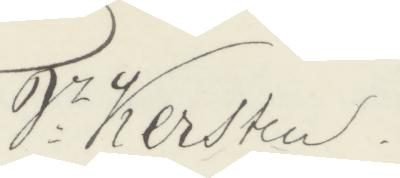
V=t Kersten
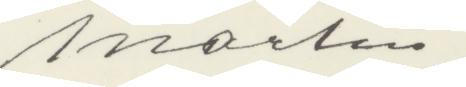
martin
